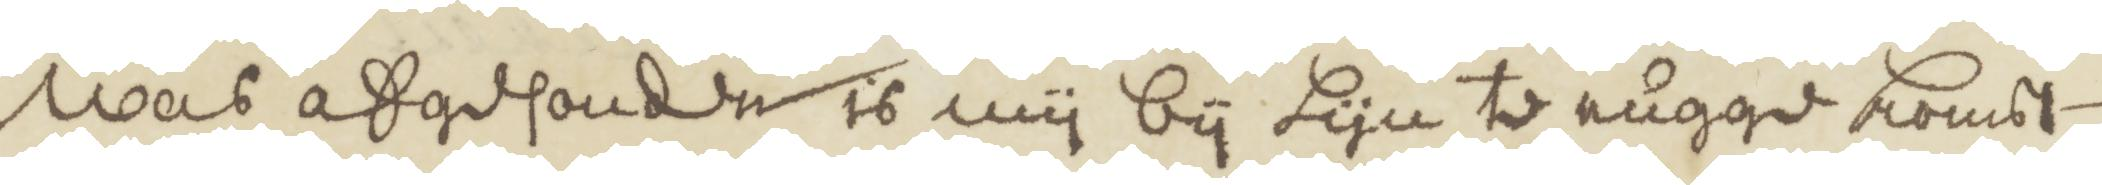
was afgesonden is mij bij sijn te rugge komst
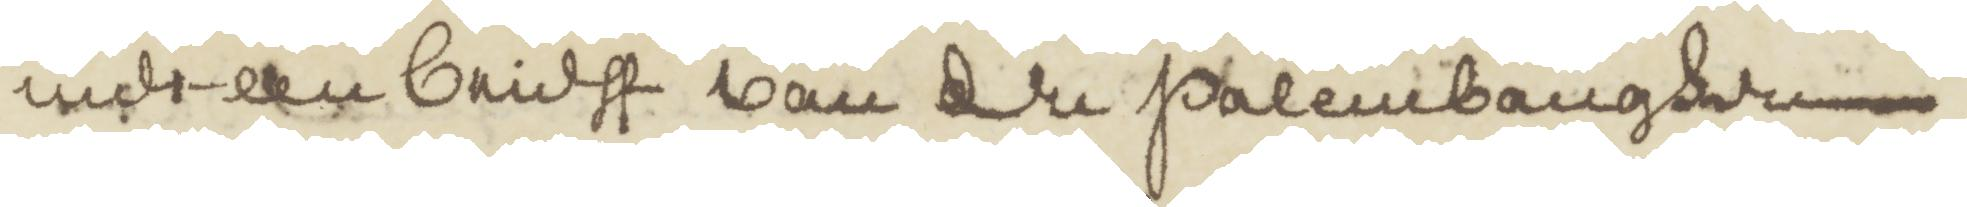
(met een brieff van den palembangsen
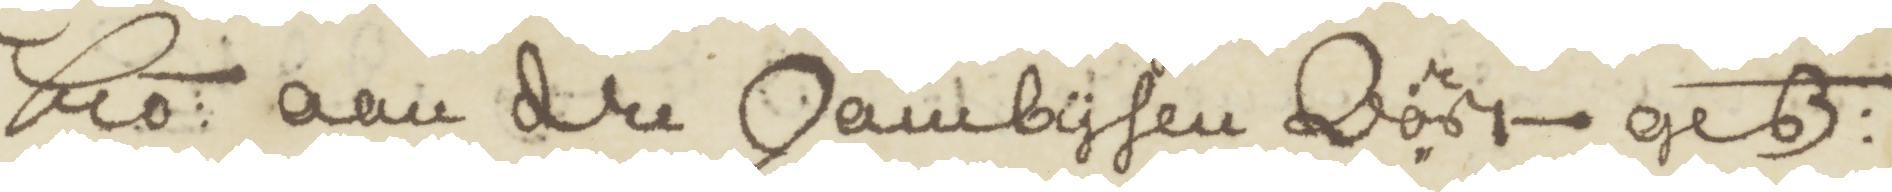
ko: aan den Jambijsen Vorst gesz:
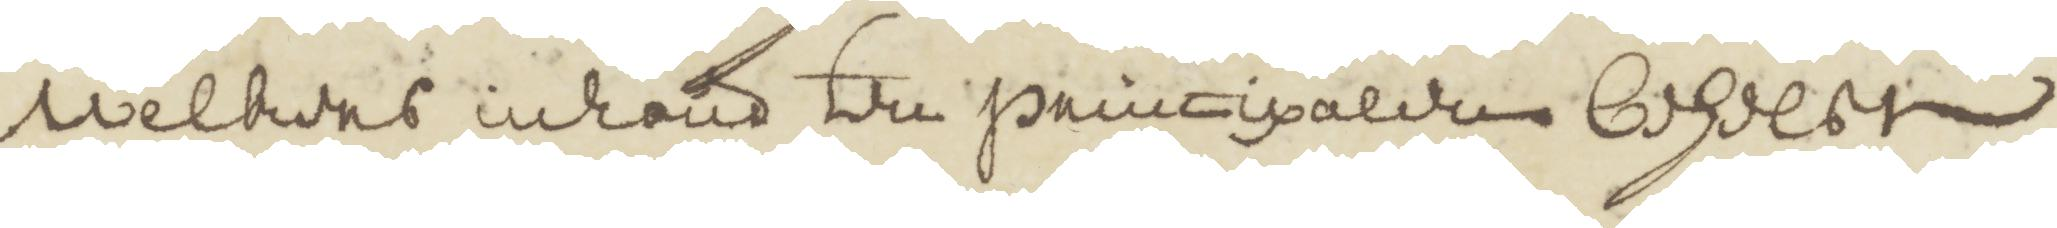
welkers inhoud ten principalen behelst
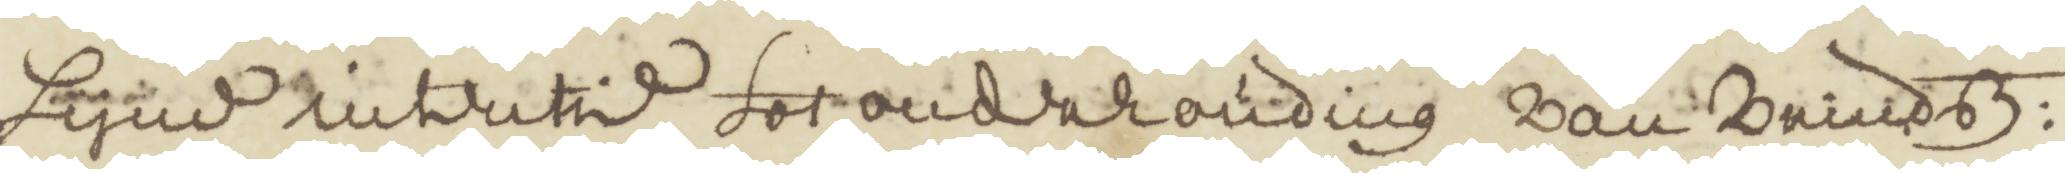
sijne intentie tot onderhouding van vrinds:
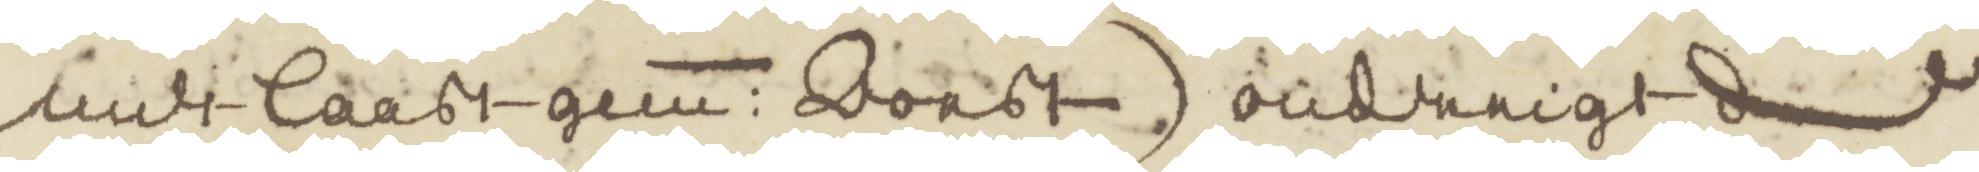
met laast gem: Vorst) onderrigt do
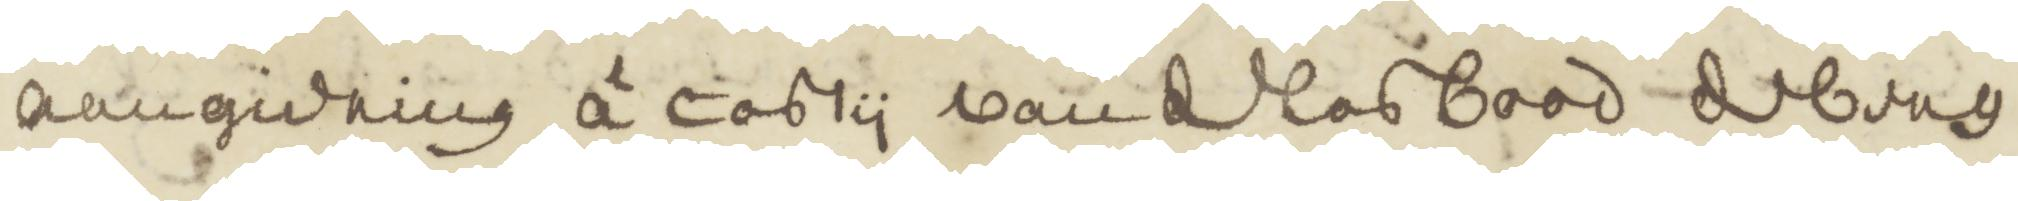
aangiering â costij van do losbood deberg
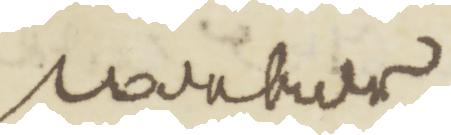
werker
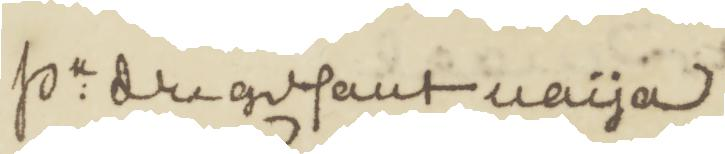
p:r den gesant naija
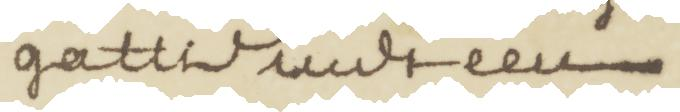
gattie met een
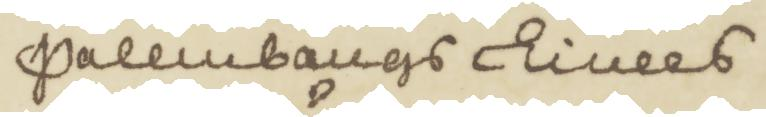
palembangs chinees
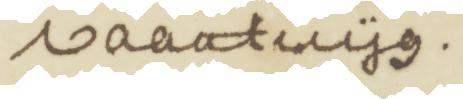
vaartuijg.
